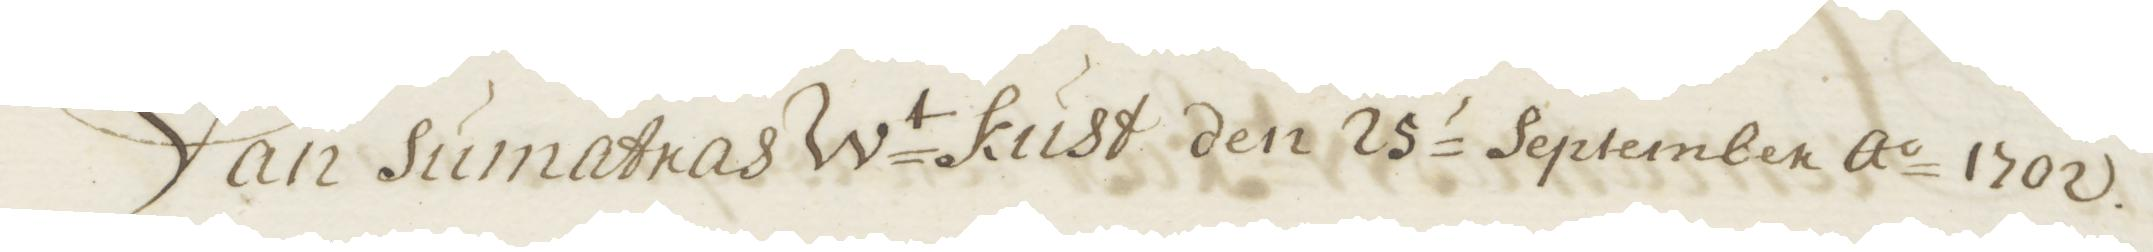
Van smatras W=t kust den 25=' September A=o 1702.
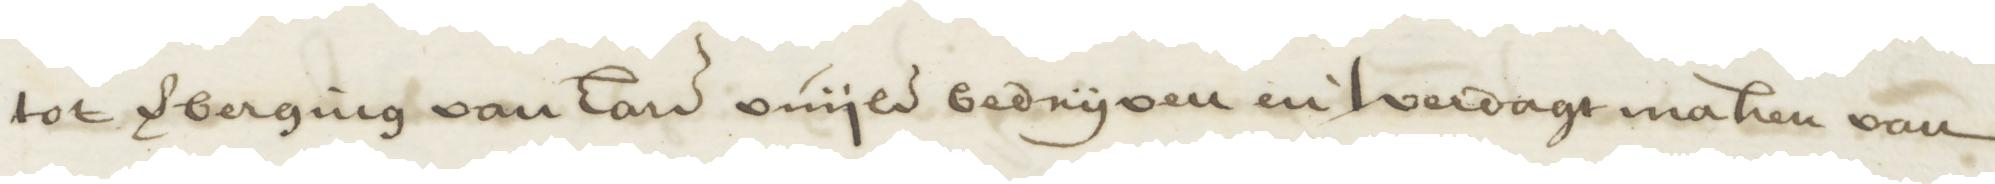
tot verberging van hare vuijle bedrijven en ’t verdagt maken van
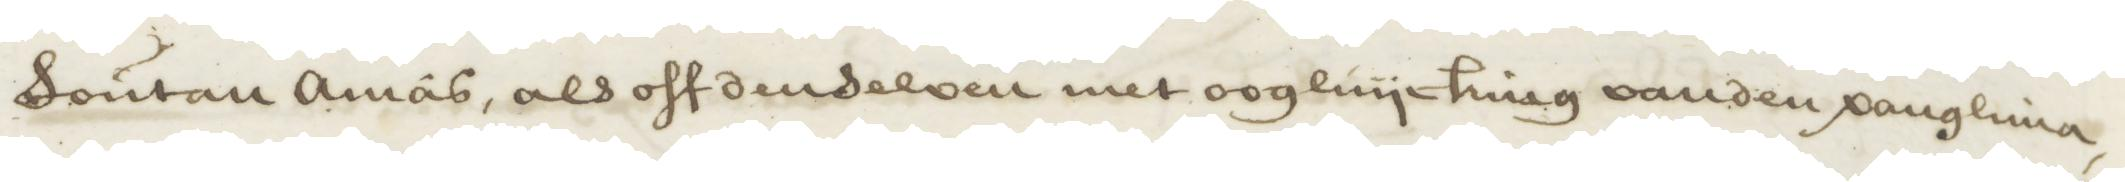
soutan Amas, als off denselven met oogluijcking van den panglima„
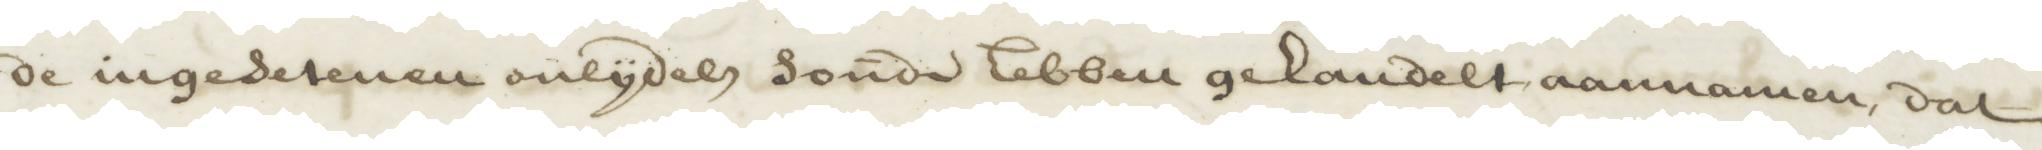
de ingesetenen onlijdelijk soude hebben gehandelt aannamen, dat
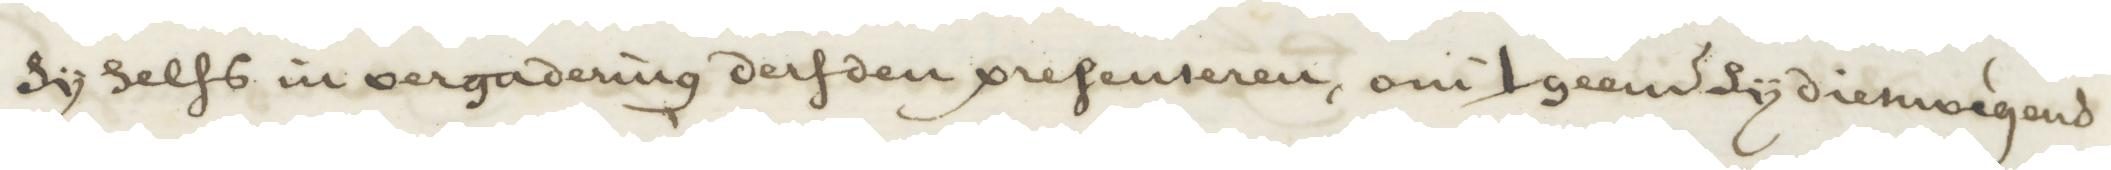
sij selfs in vergadering derfden presenteren, om ’t geene sij dietwegens
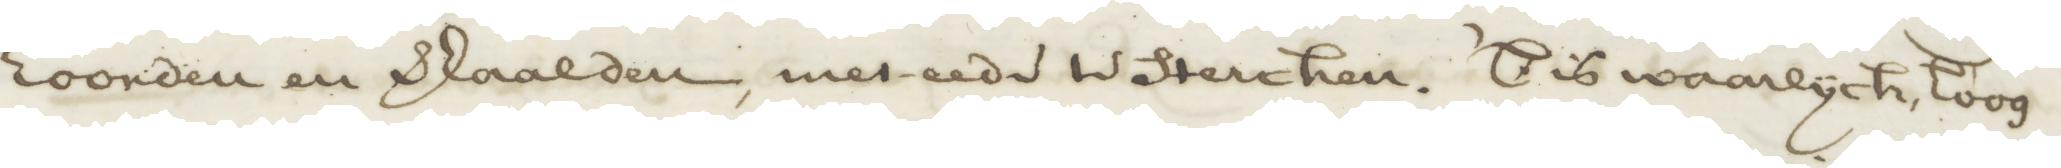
hoorden en verhaalden, met eede te stercken. 'T is waarlijck, hoog
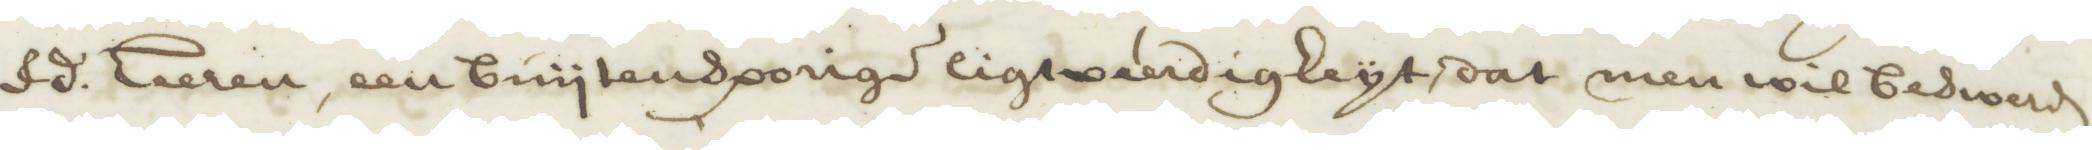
Ed. heeren, een buijtensponge ligtveerdigheijt, dat men wil besweren
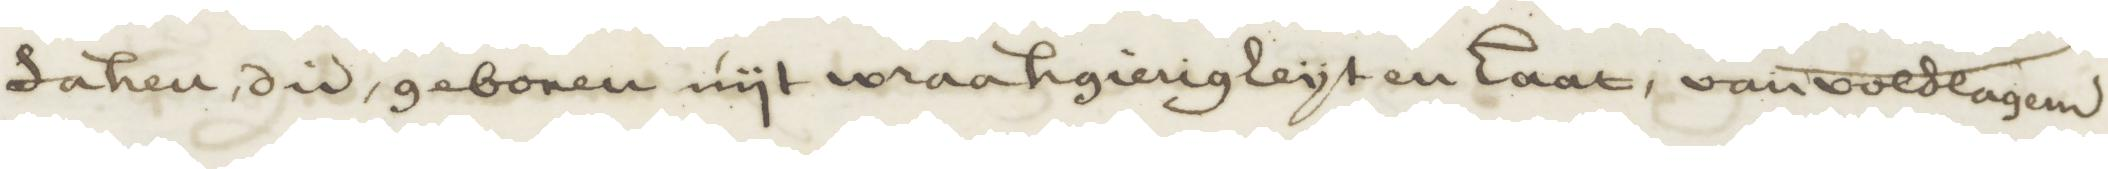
saken, die, geboren uijt wraakgierigheijt en haat, van volslagene
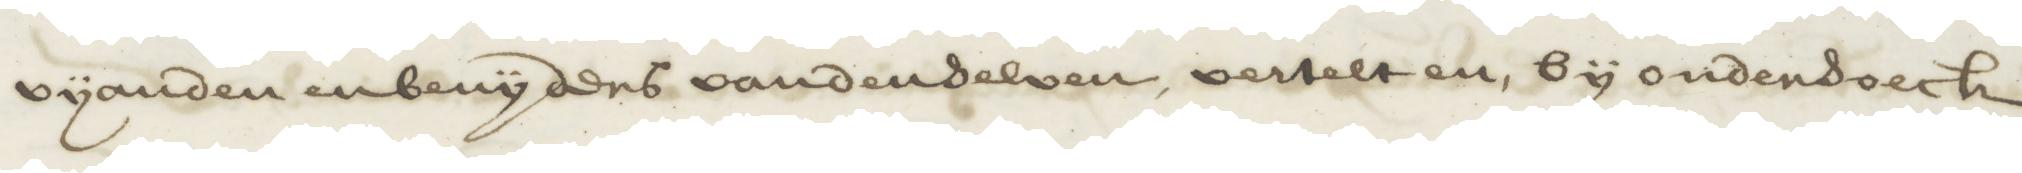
vijanden en benijders van denselven, vertelt en, bij ondersoeck
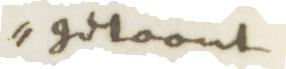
„getoont
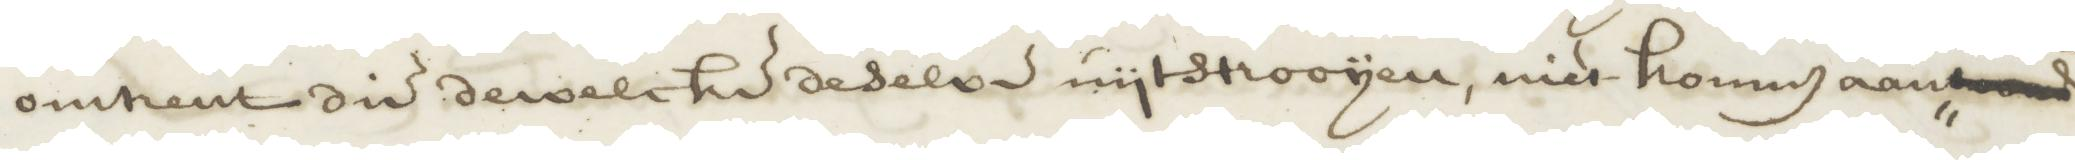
omtrent die dewelcke deselve uijtstrooijen, niet konnen aan „
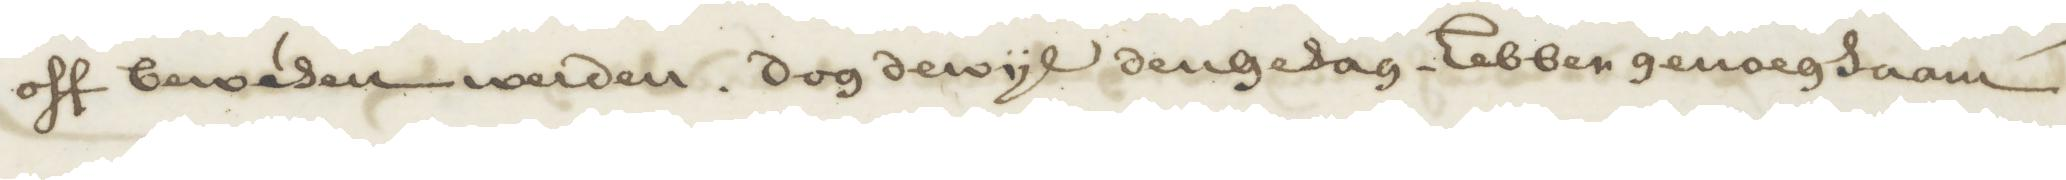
off bewesen werden. dog dewijl den gesag-hebber genoegsaam
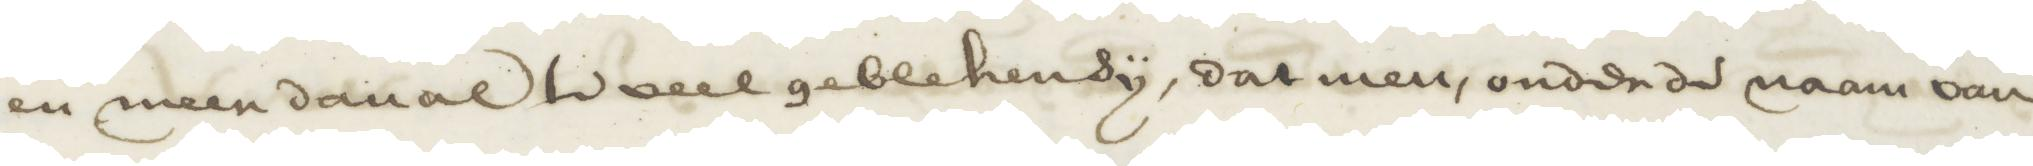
en meer dan al te veel gebleken sij, dat men, onder de naam van
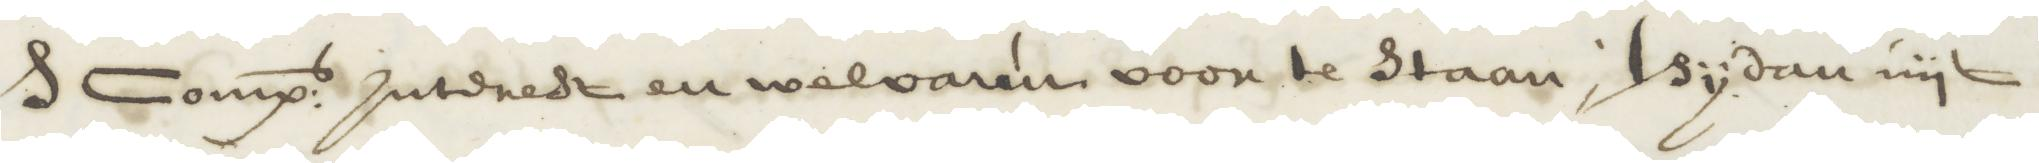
'S Comp:s jnterest en welvaren voor te staan 't sijdan uijt
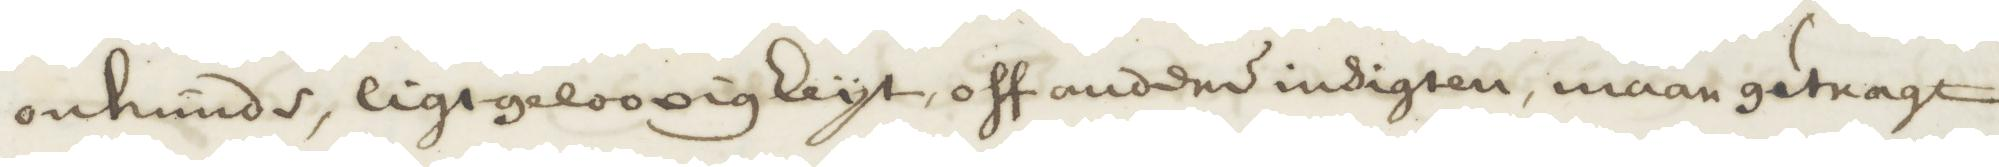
onkunde, ligtgeloovigheijt, off andere insigten, maar getragt
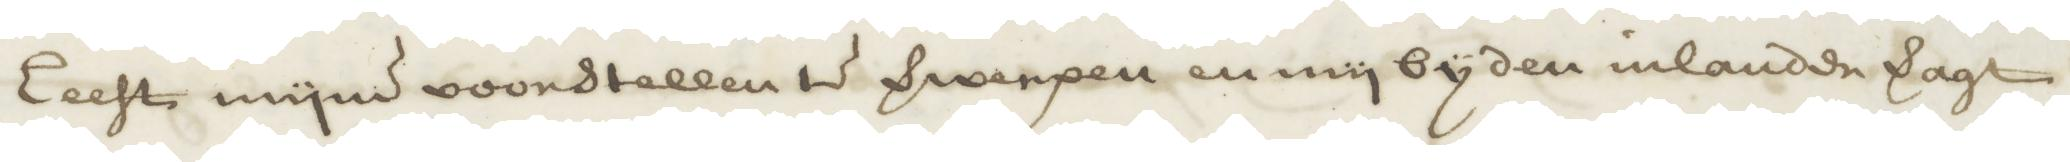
heeft mijne voorstellen te verwerpen en mij bijden inlander veragt
